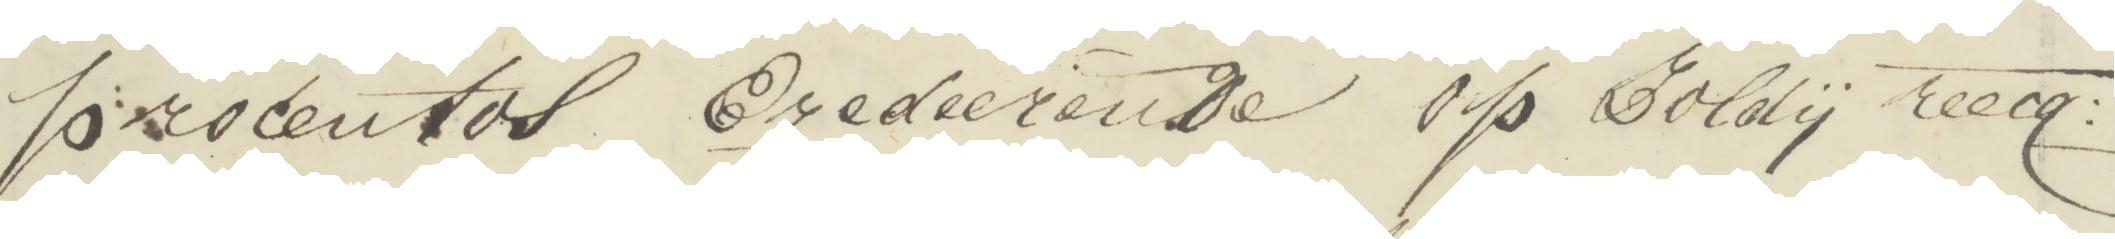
procentos Exedeerende op zoldij reecq:
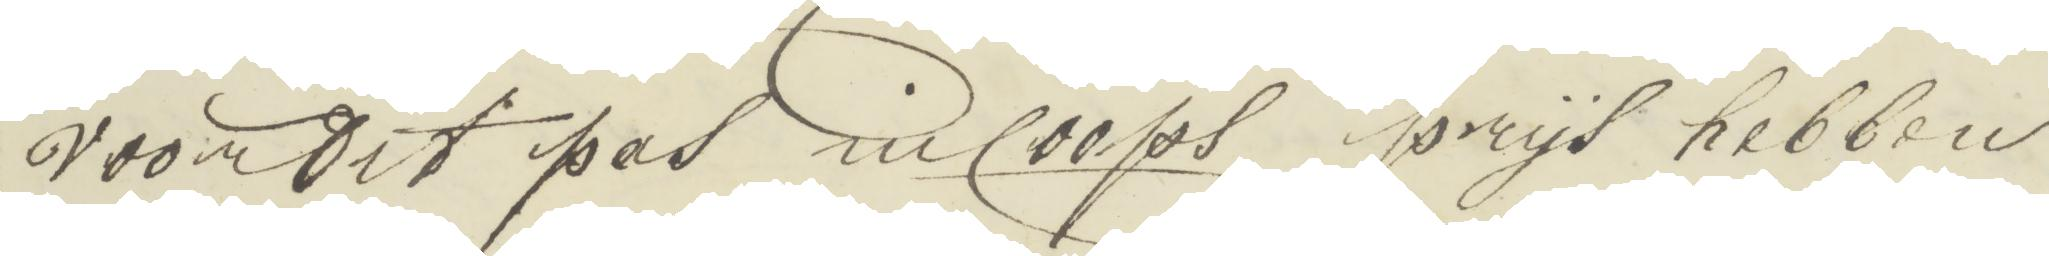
voor dit pas incoops prijs hebben
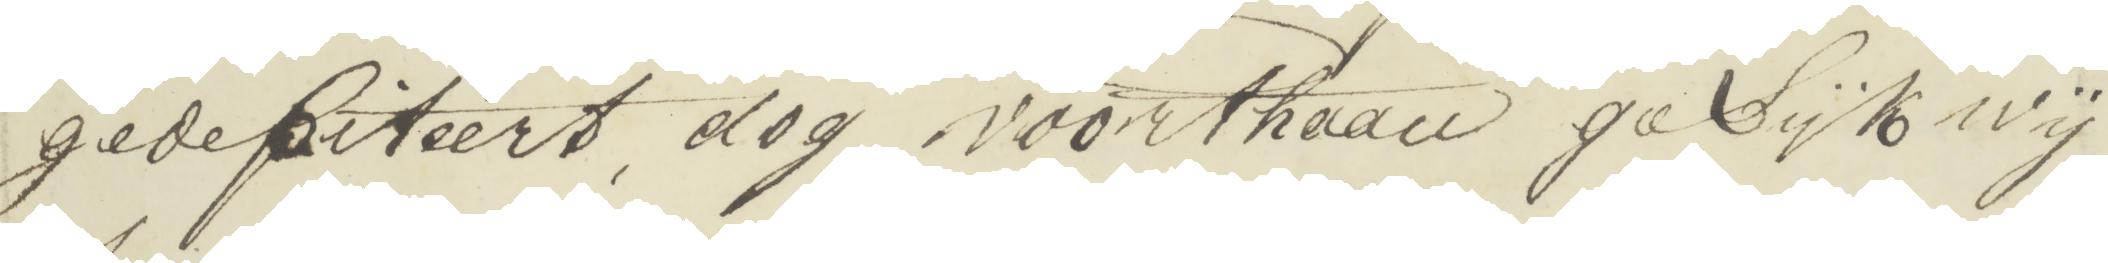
gedebiteert, dog voorthaan gelijk wij
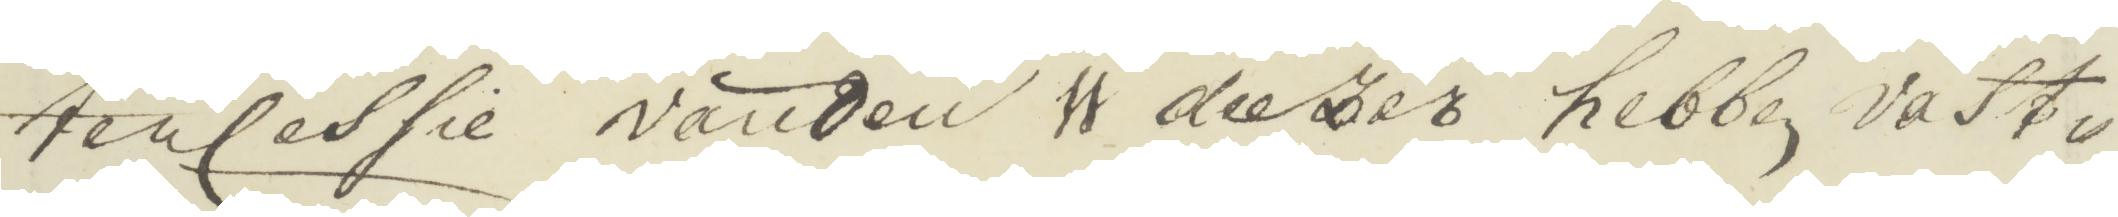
tercessie vanden 11 deezer hebben vast
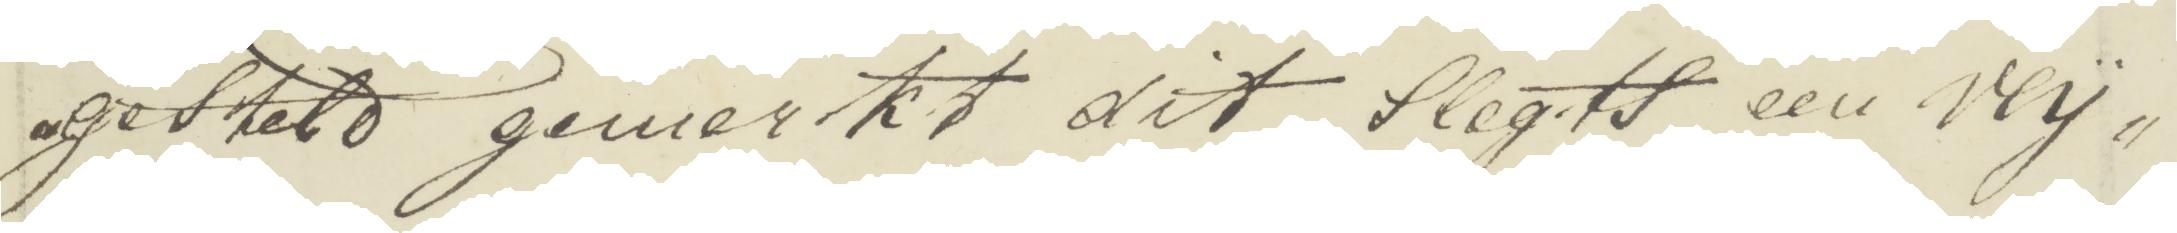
gesteld gemerkt dit slegts een veij„
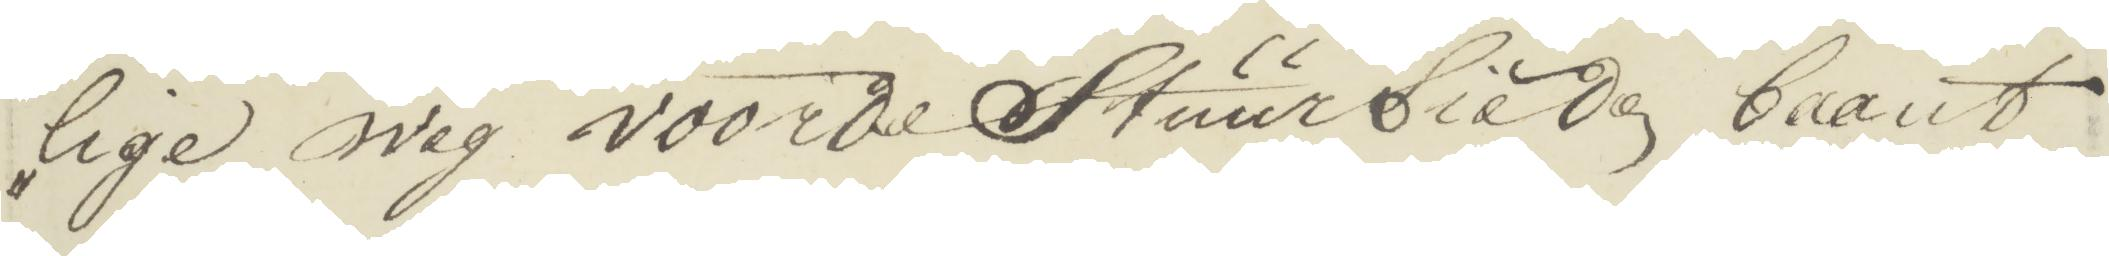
„lige weg voorde Stuurlieden baant
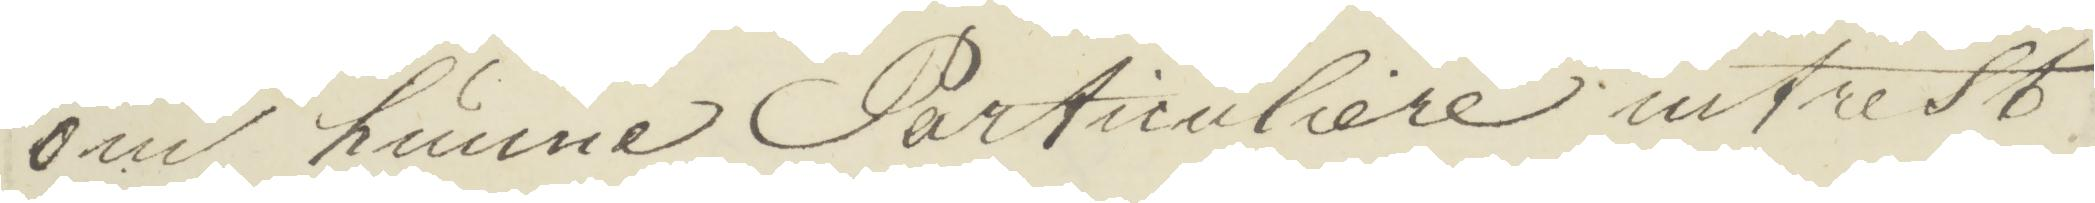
om hunne Particuliere intrest
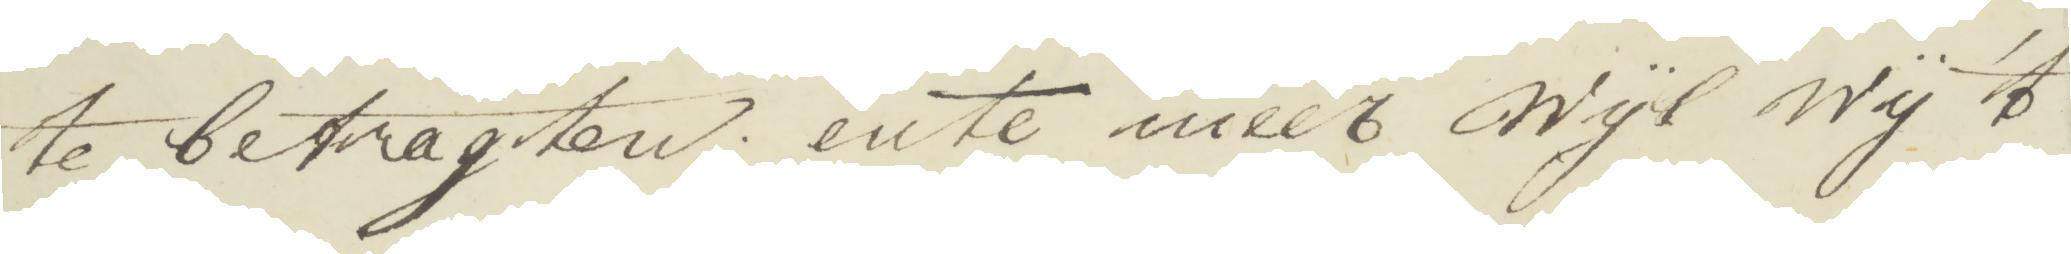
te betragten; en te meer wijl wij 't
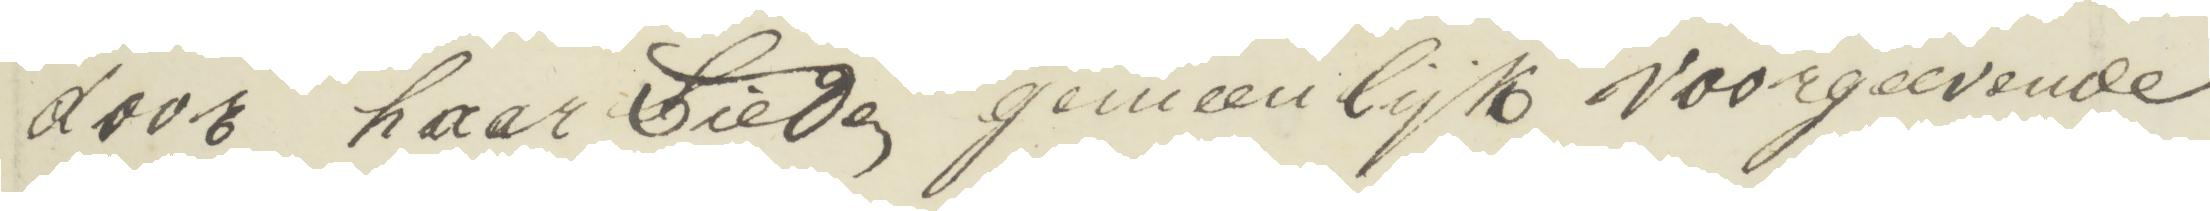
door haar Lieden gemeenlijk voorgeevende
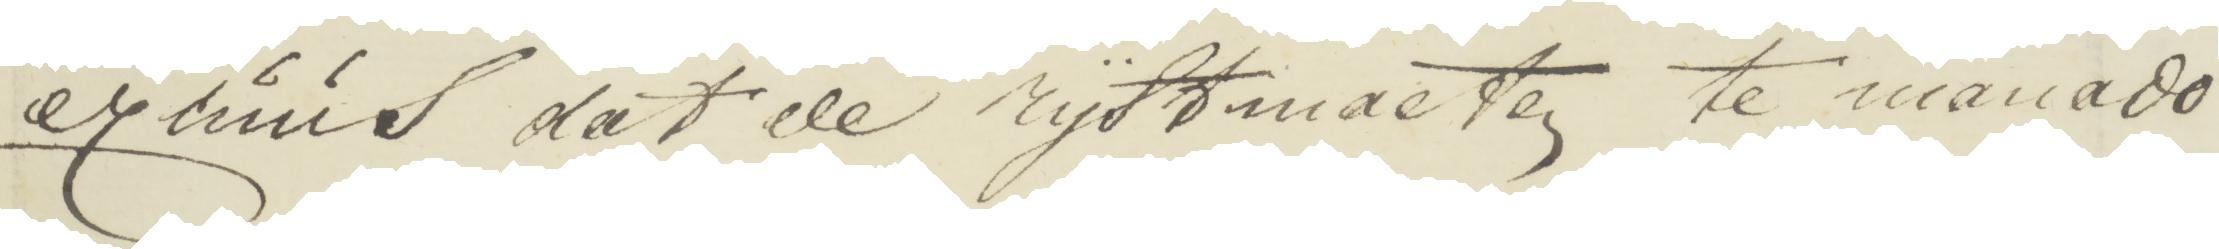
excuus dat de rijstmaeten te manado
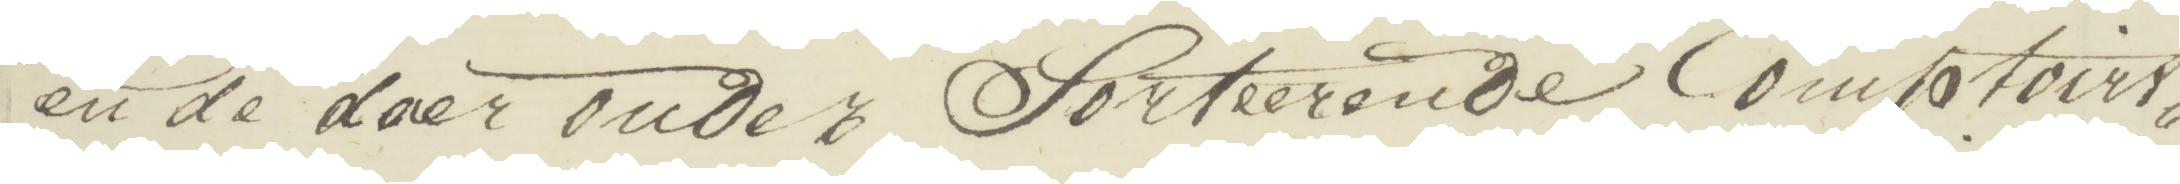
en de daer onder sorteerende Comptoir
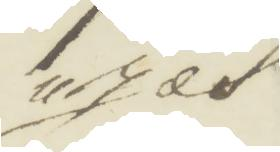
jes
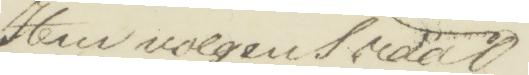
Hem volgens raad
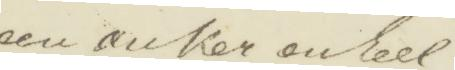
een anker en heel
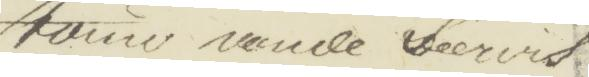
touw van de Leervis
